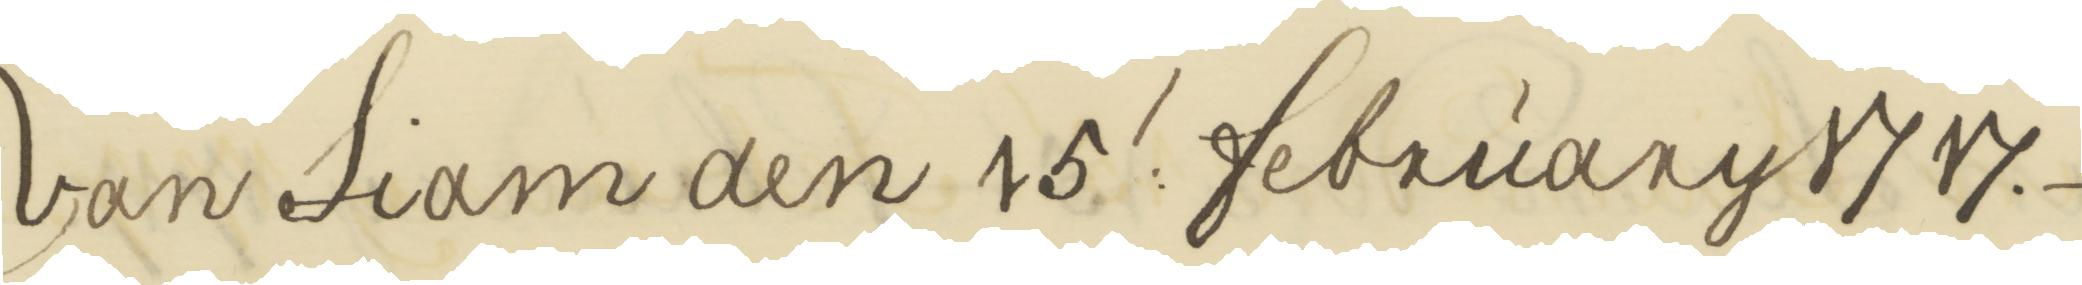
Van Siam den 15:' february 1717.
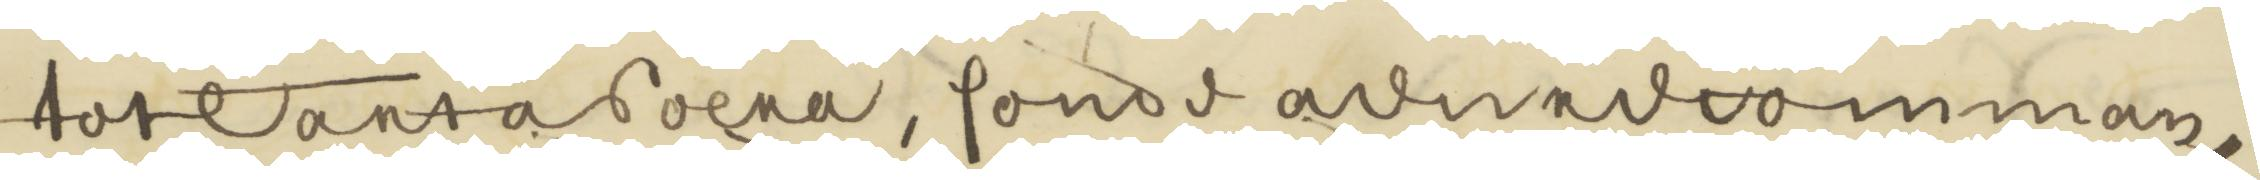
tot Cartasoera, soude aen recomman„
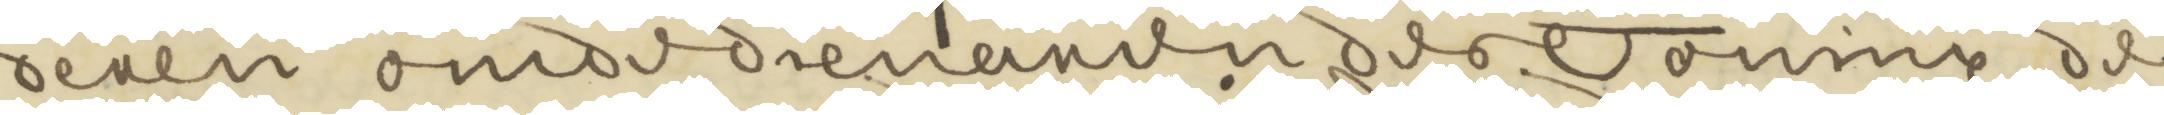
deren omde dienaren des Coninx de
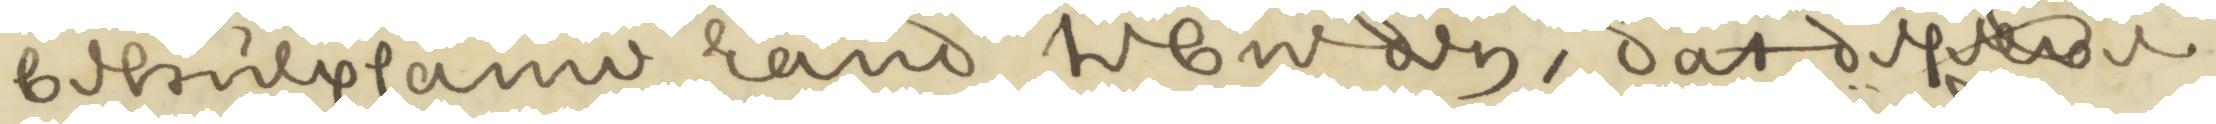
behulpsame hand te bieden, dat deselve
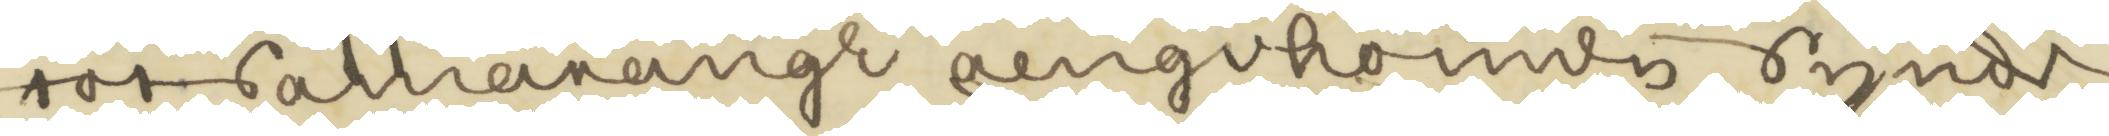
tot samarangh aengekomen sijnde
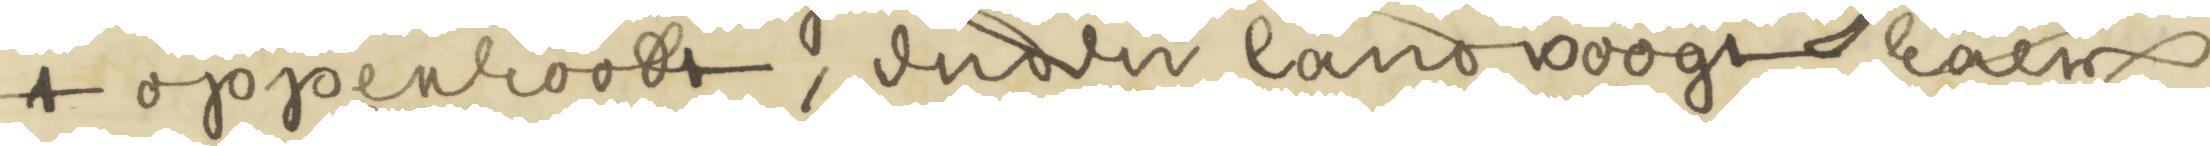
t opperhooft, enden landvoogt haer
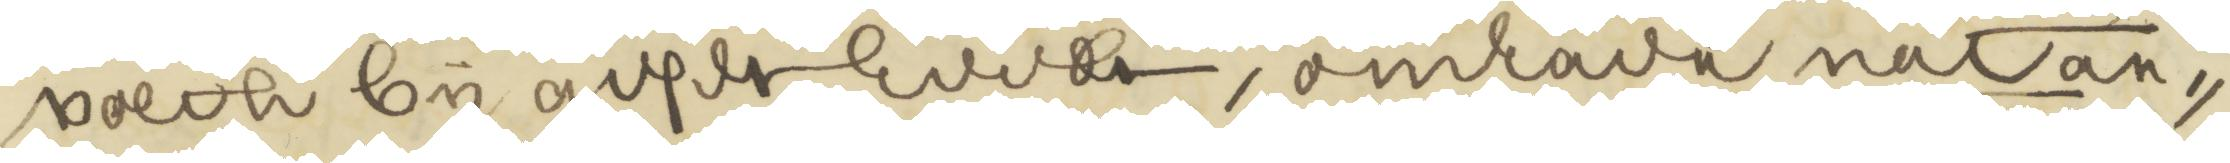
volck bij geset heeft, omhaer na Car„
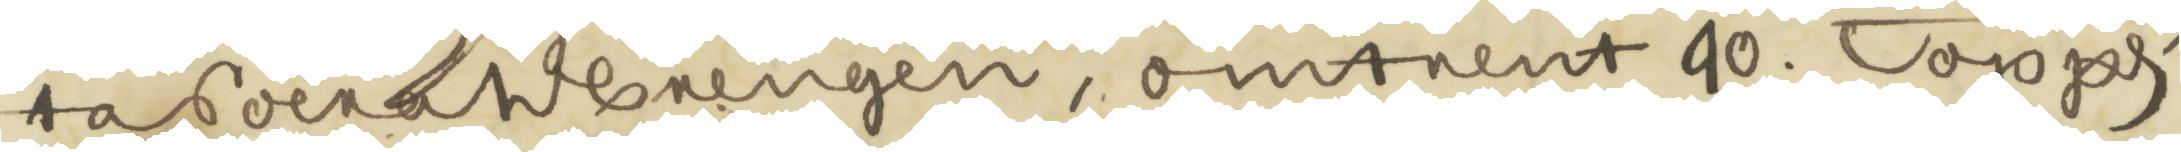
tasoera te brengen, omtrent 40. Coppen
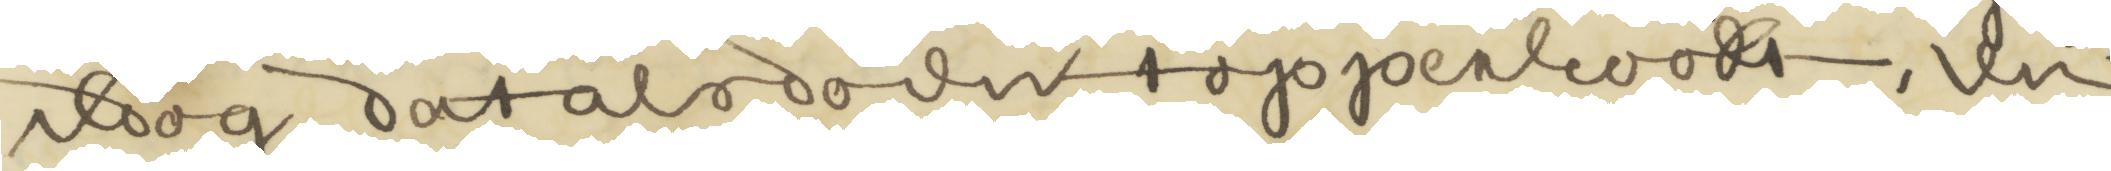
Edog dat als doen t opperhooft, en
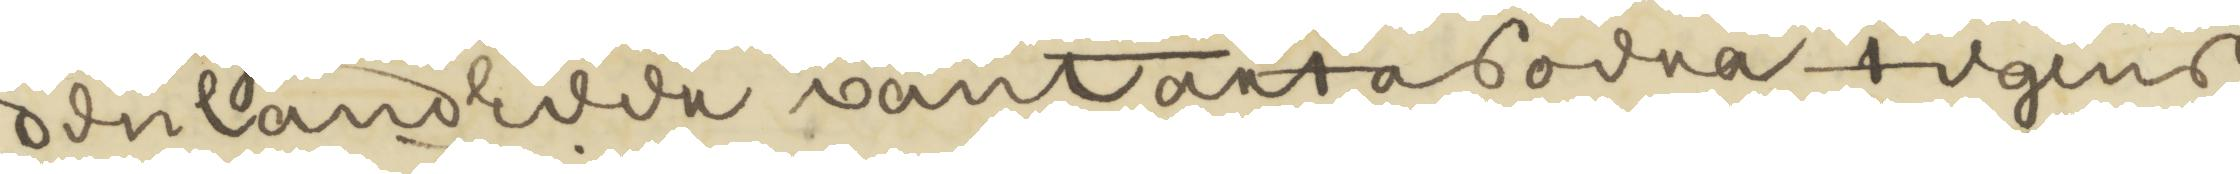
den landheer van Cartasoera tegens
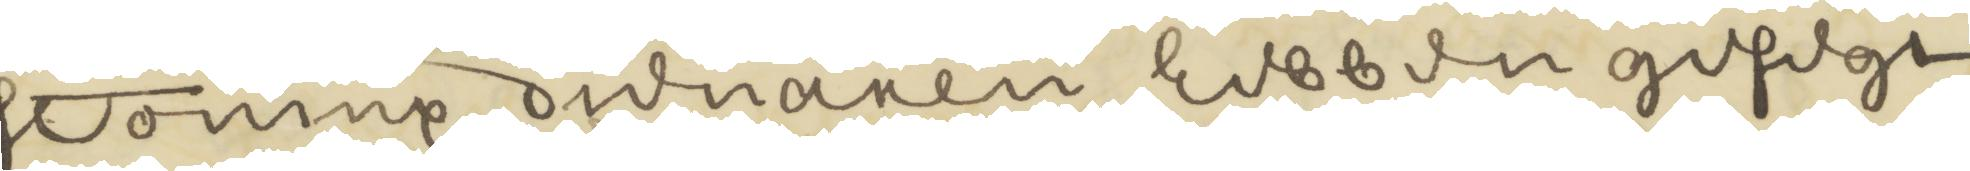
sConinx dienaren hebben gesegt
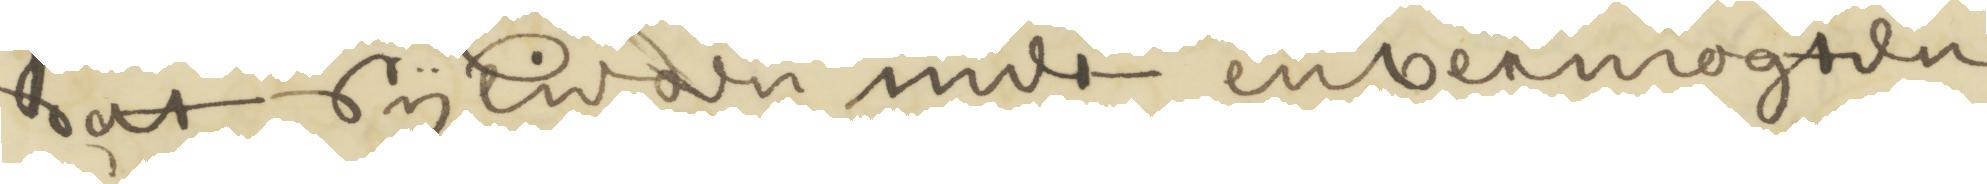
dat sij lieden niet en vermogten
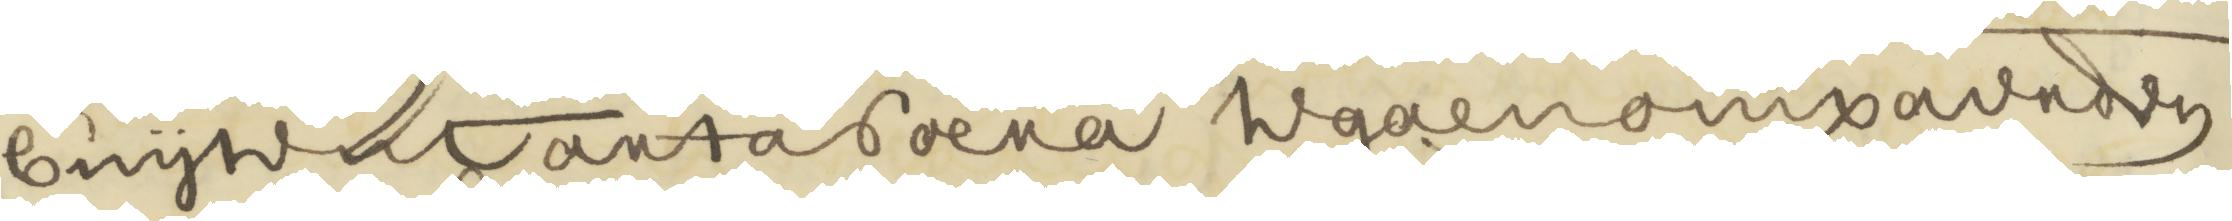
buijten Cartasoera te gaen om paerden
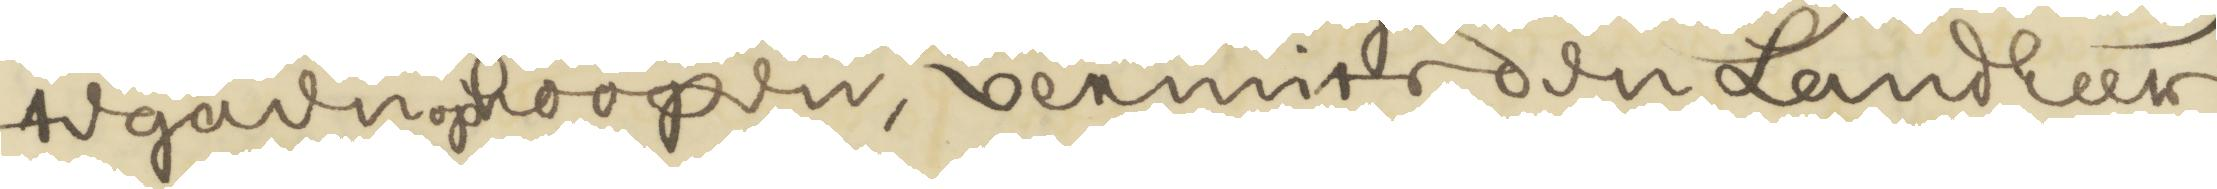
te gaen op koopen, vermits den Landheer
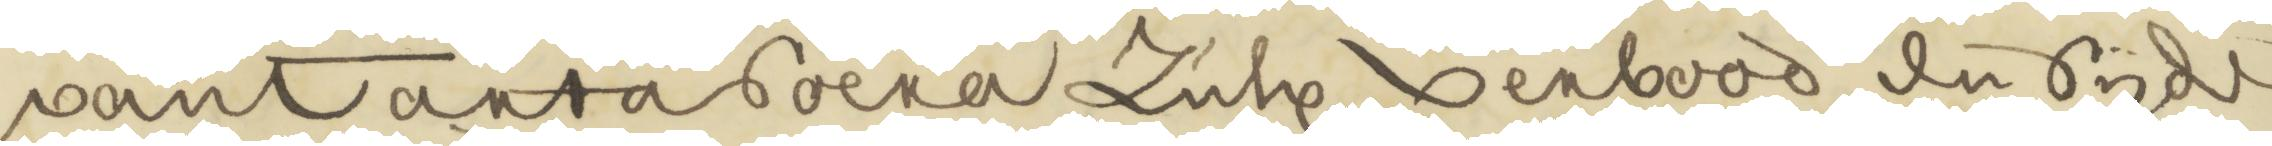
van Cartasoera Zulx verbood en sijde
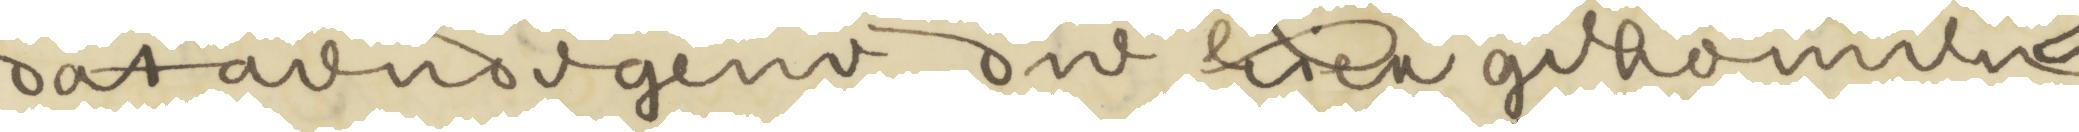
dat aendegene die hier gekomen
